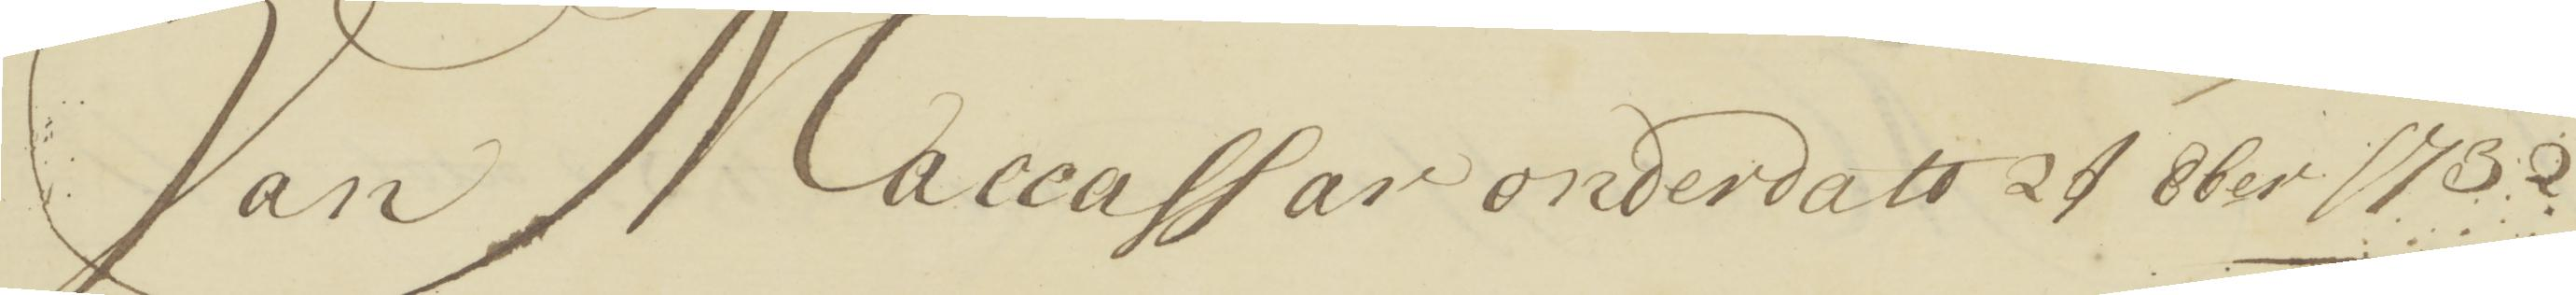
Van Maccassar onder dato 24 8ber 1732.
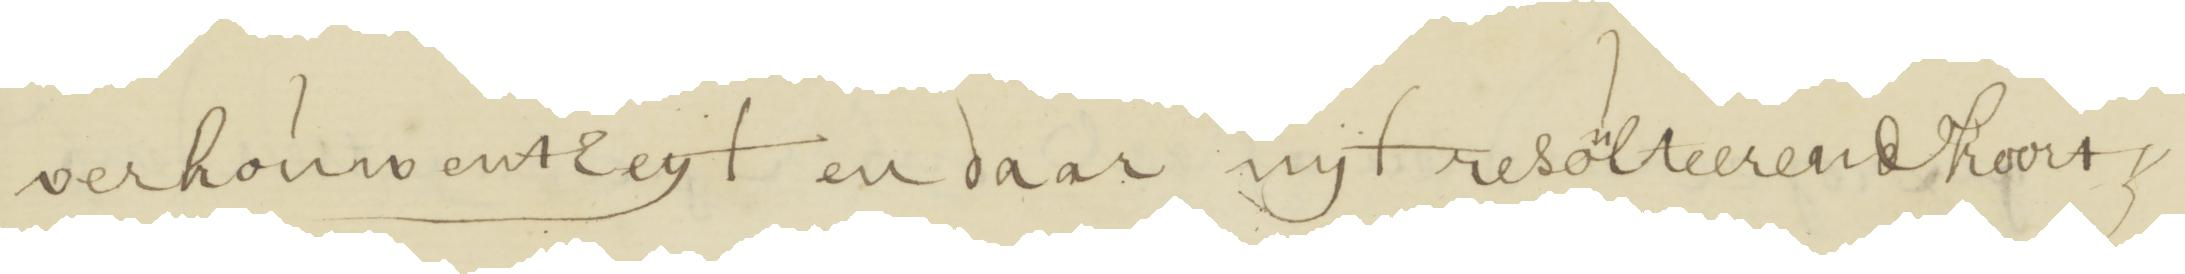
verkouwentheijt en daar uijt resoulteerende koort„
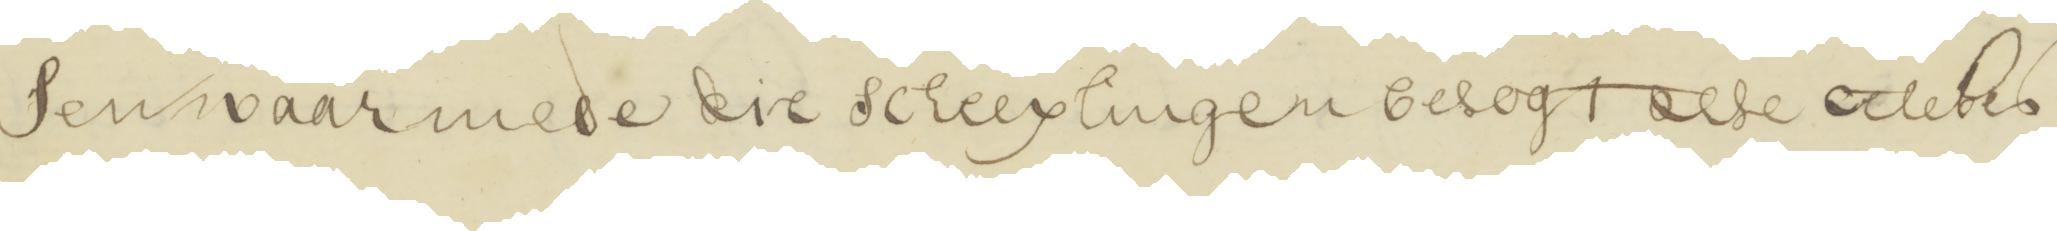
sen waar mede die scheeplingen besogt dese celebes
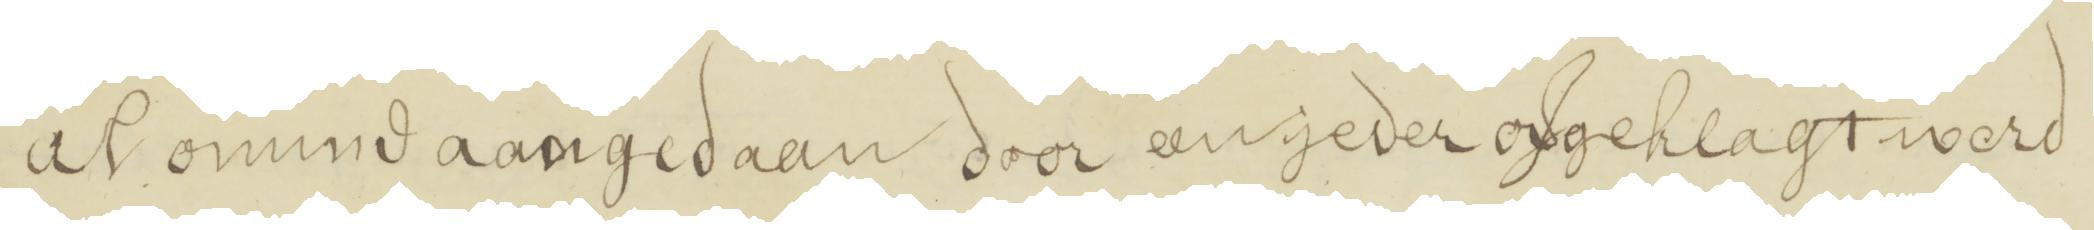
al omme aangedaan door een jeder overgeklagt werd
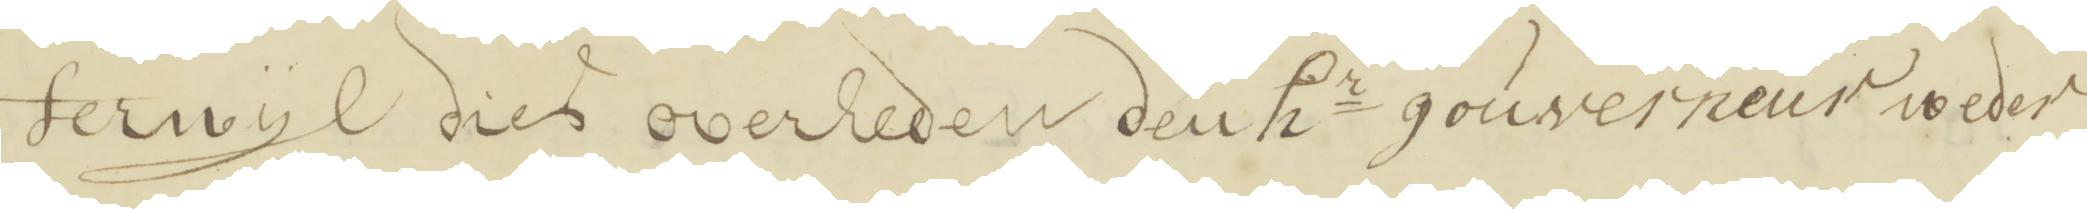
terwijl dies overheden den h=r gouverneur weder
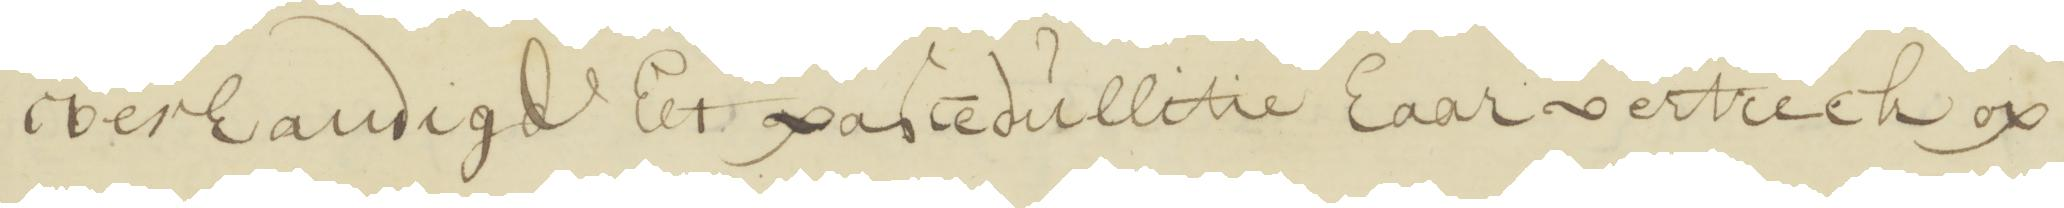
overhandigde het pascedullitie haar vertreck op
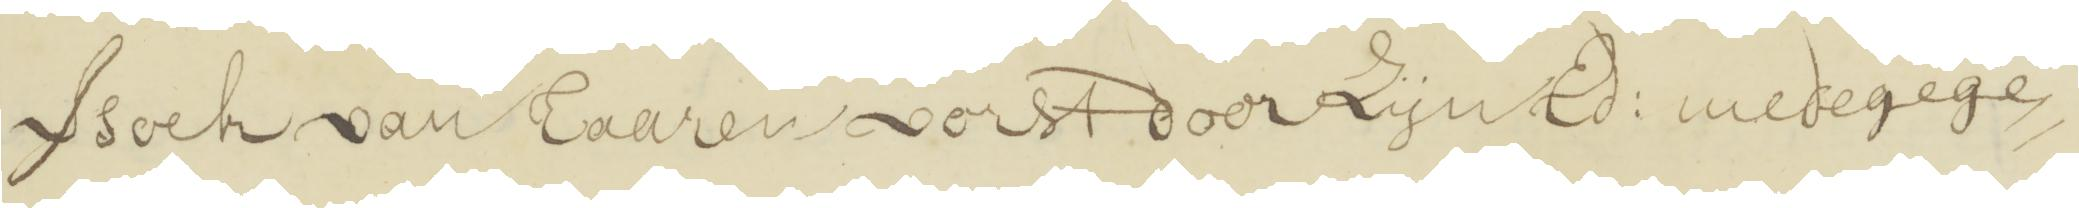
versoek van haaren vorst door zijn Ed: medegege„
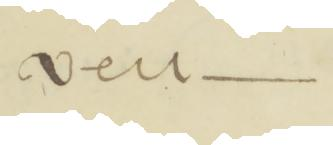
ven —
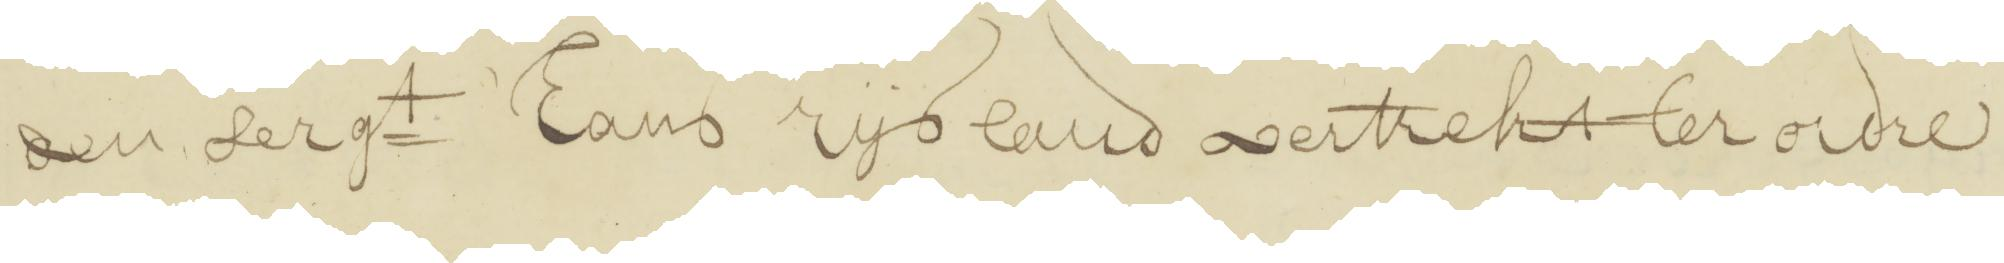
den serg=t hans rijsland vertrekt ter ordre
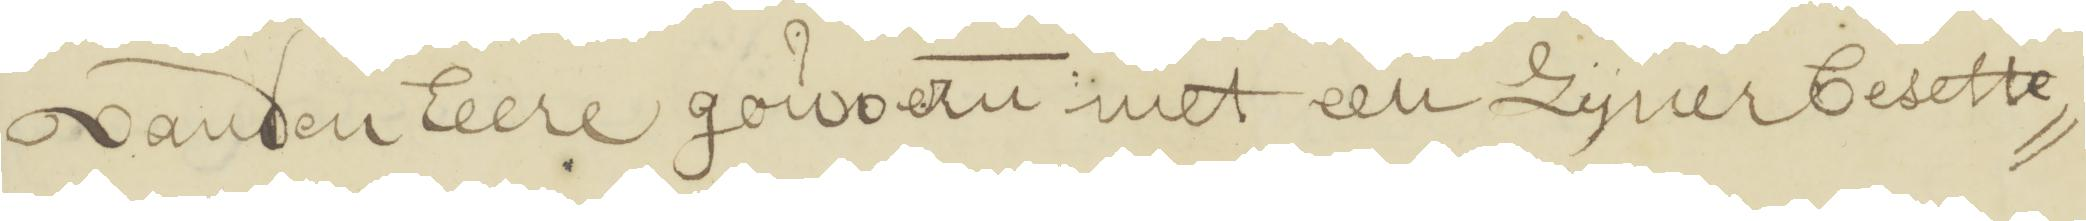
vanden heere gouvern: met een zijner besette„
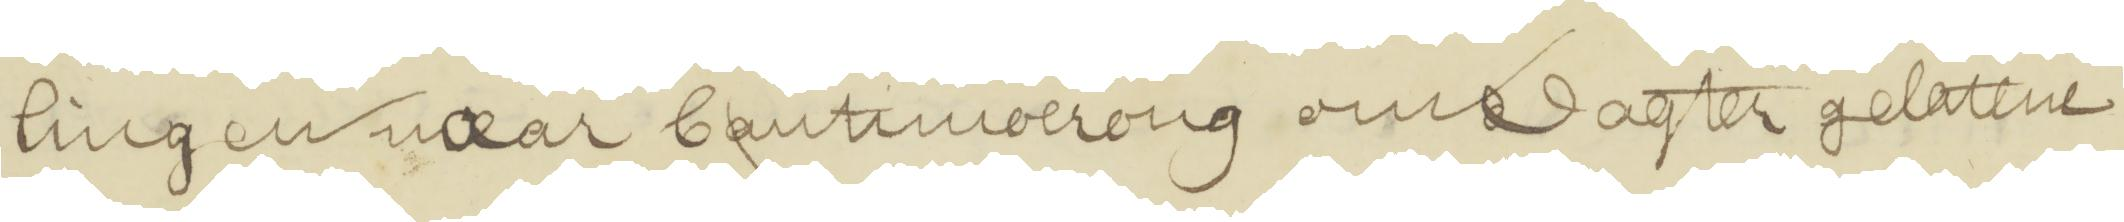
lingen naar bantimoerong om de agter gelatene
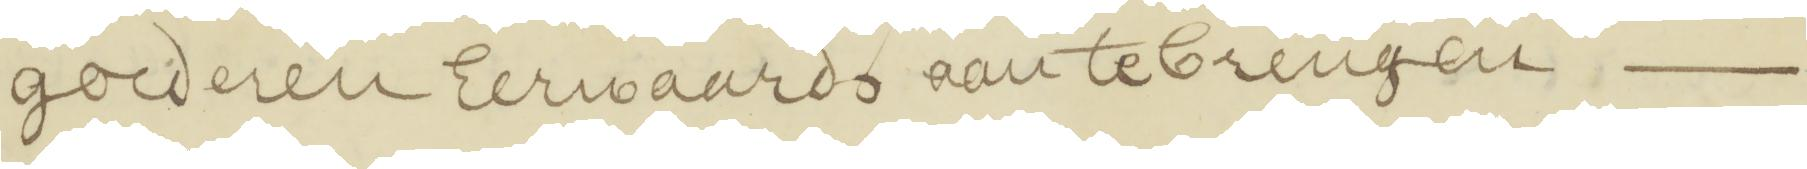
goederen herwaards aan te brengen —
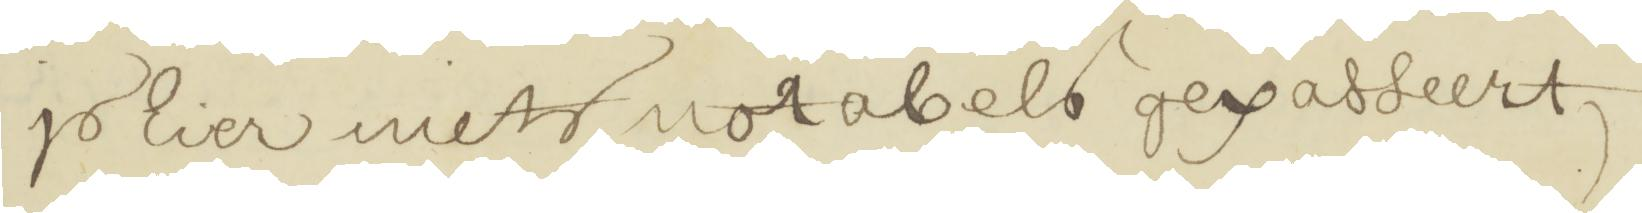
js hier niets notabels gepasseert
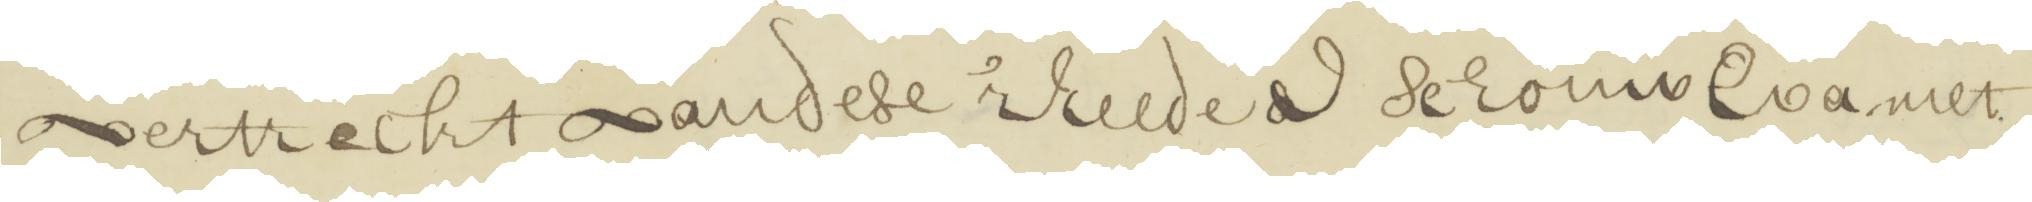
vertreckt van dese rheede de schouw Eva met
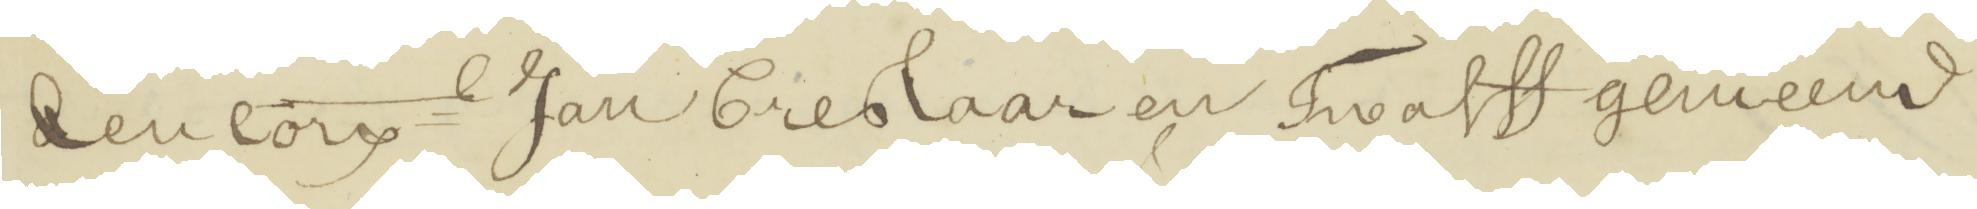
den corp=l Jan breslaar en Twalff gemeene
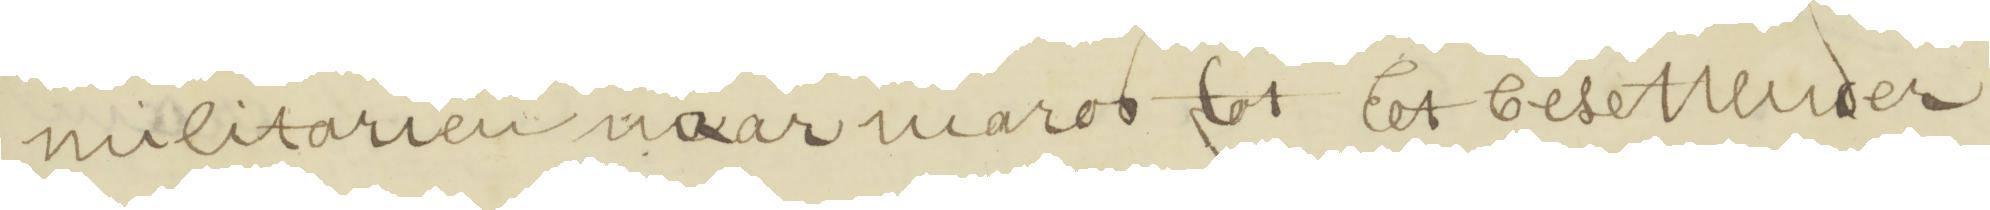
militarien naar maros tot het besetten der
